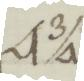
4¾
